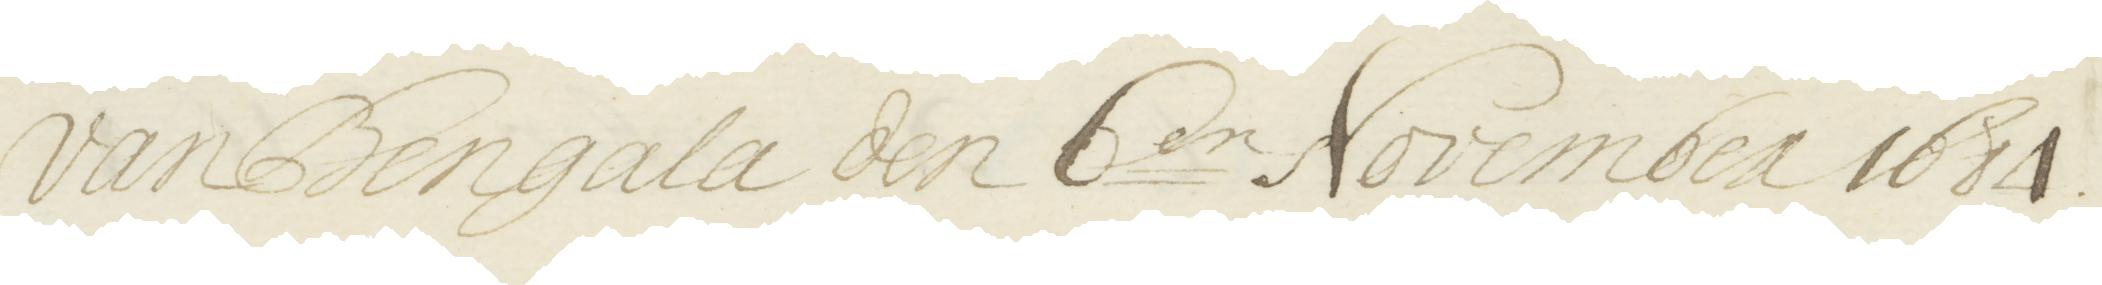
van Bengala den 6=en November 1684.
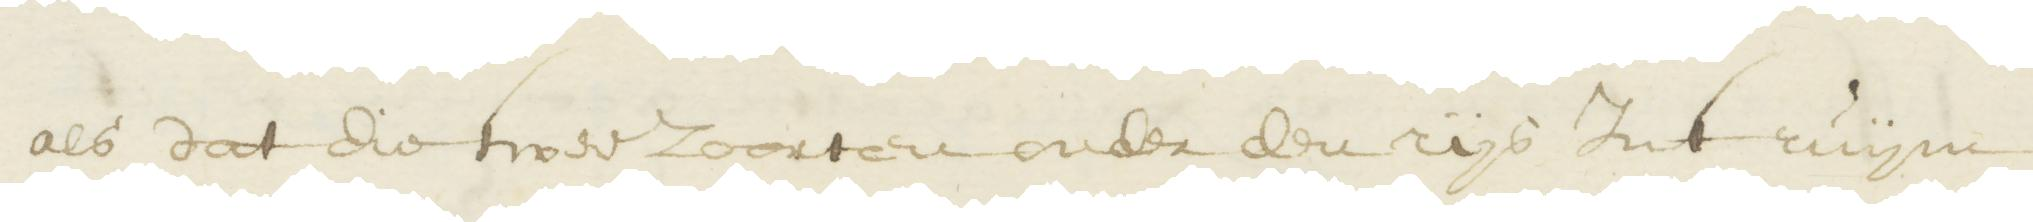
als dat die twee zoorten onder den rijs Int ruijm
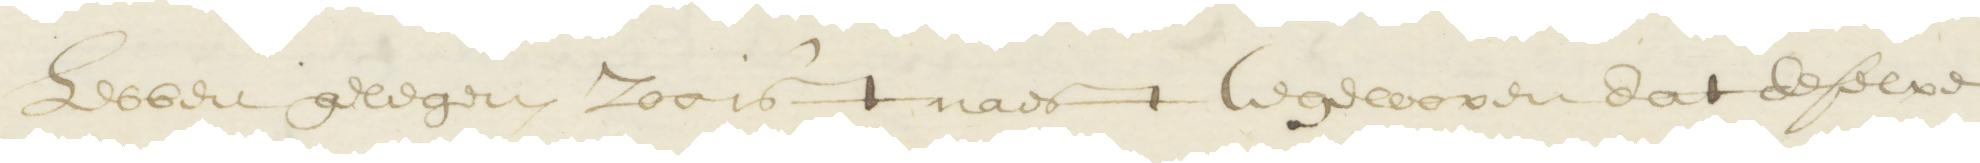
hebben gelegen zoo is 't naest te gelooven dat deselve
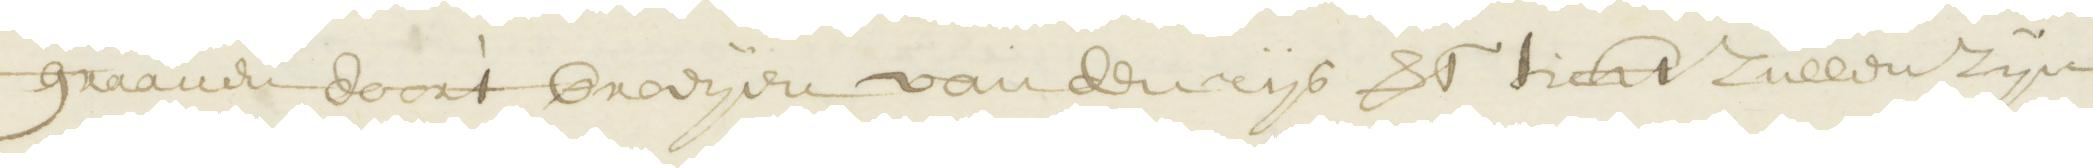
graanen door ’t broeijen van den rijs versticht zullen zijn
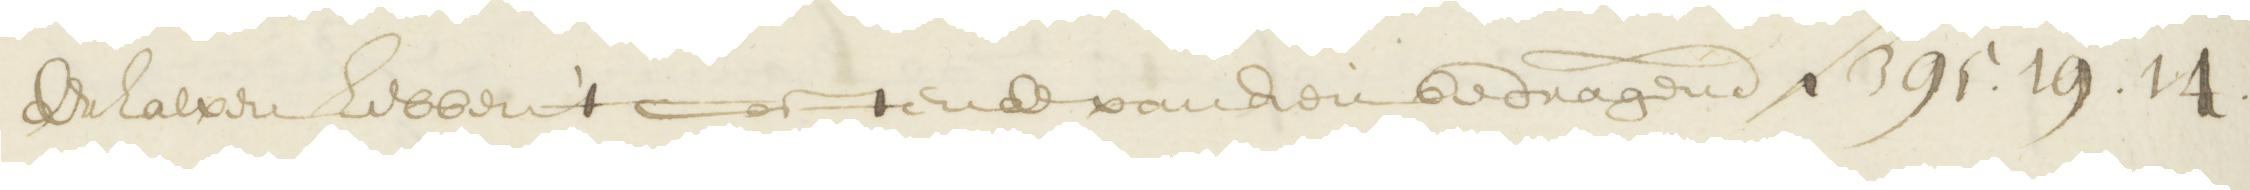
derhalven hebben 't costende van den bedragend ƒ 395.19.14.
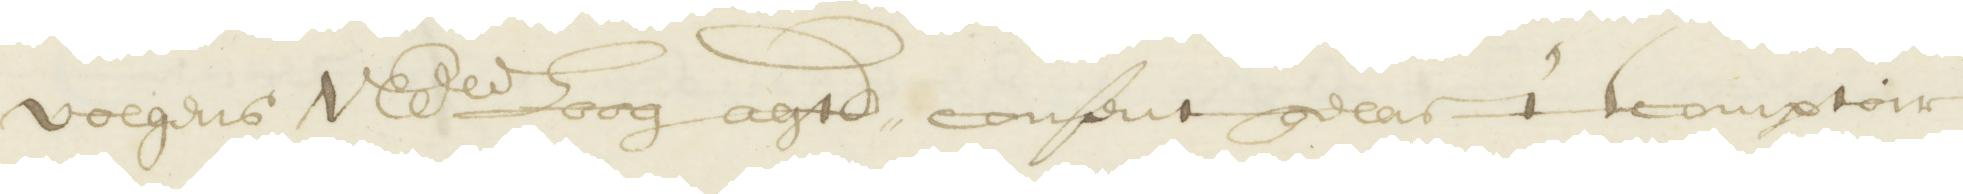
volgens VEd=le Hoog agtb„ consent gelast 't comptoir
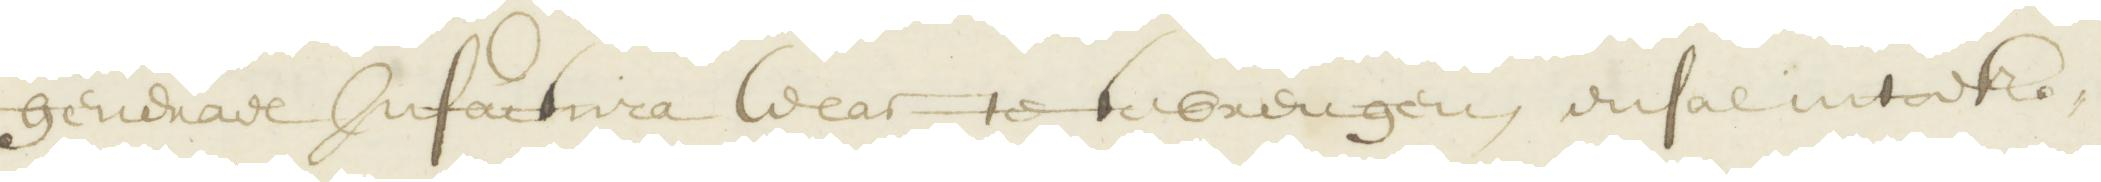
generael jn Factura te laste te brengen, en sal intoeko„
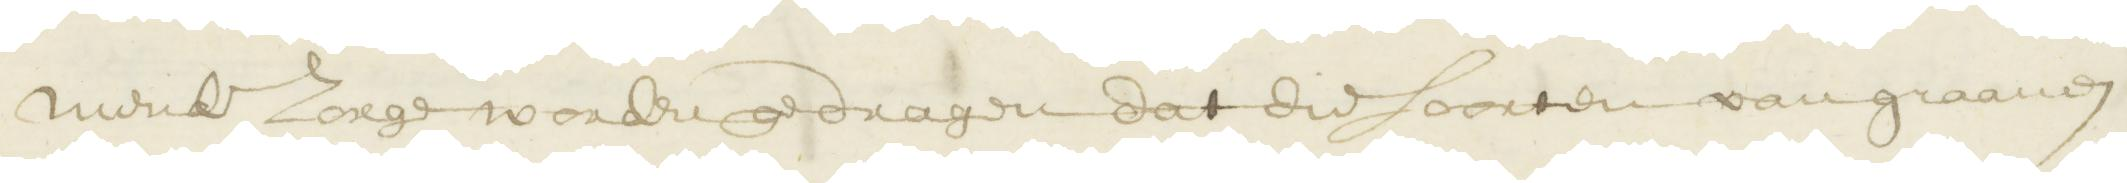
mende zorge worden gedragen dat die soorten van graanen
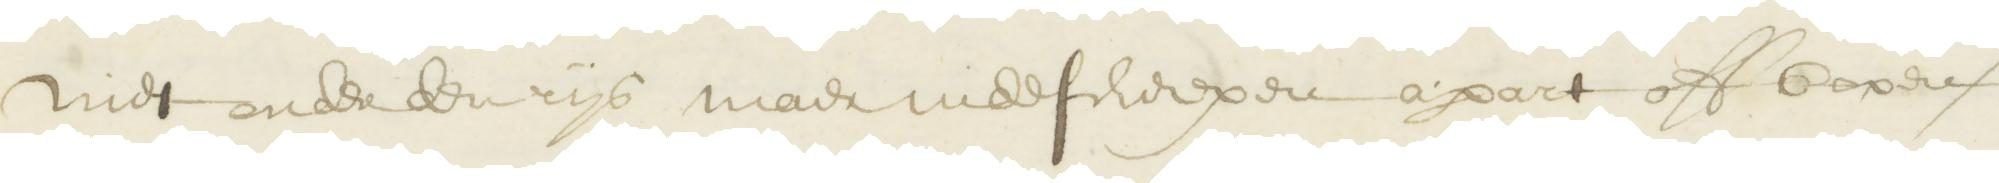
niet onder den rijs maer in de scheepen apart off boven
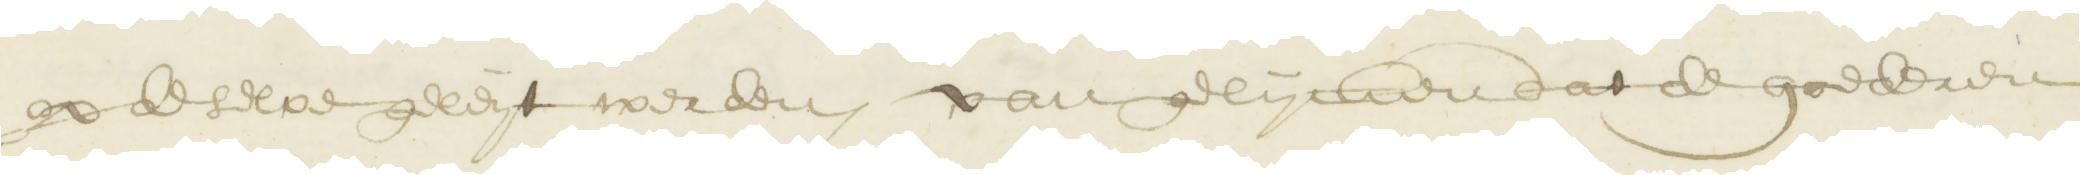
op deselve geleijt werden, van gelijcken dat de goederen
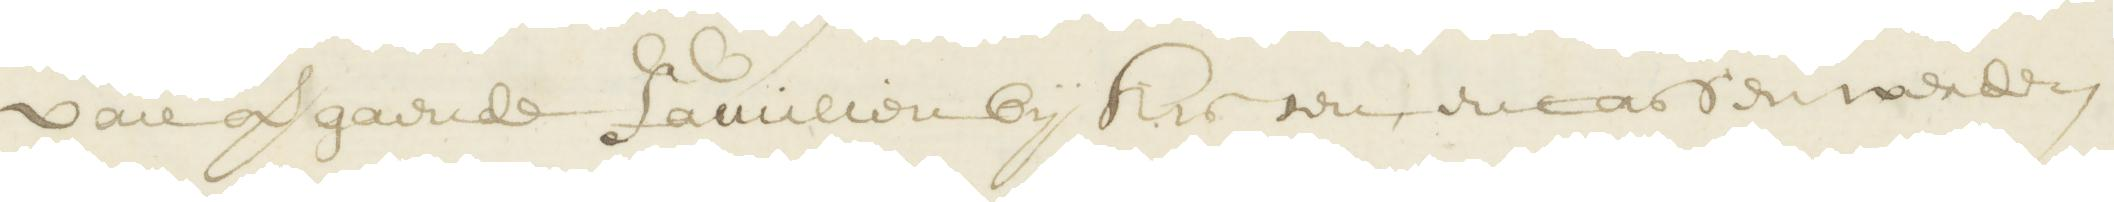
van overgaende Familien bij kisten, en cassen werden
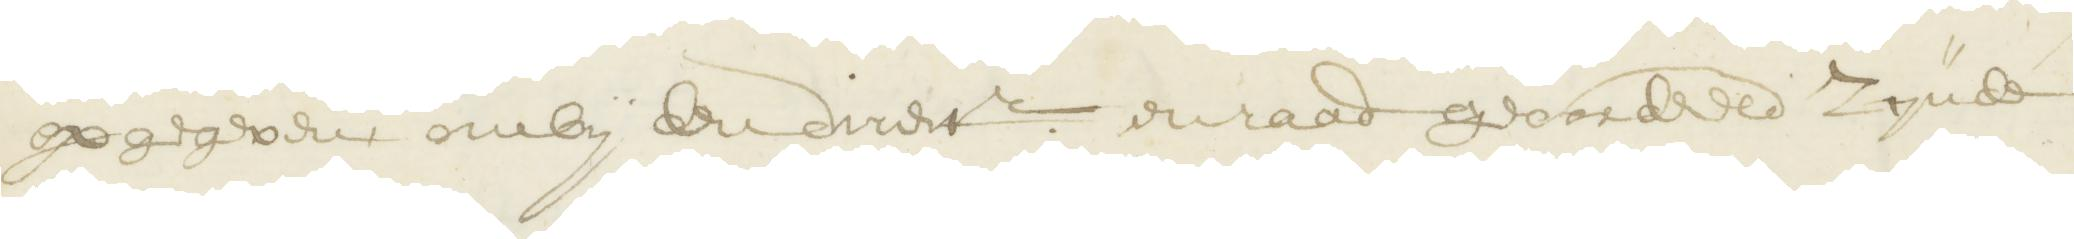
opgegeven, om bij den direct.r en raad geoordeeld zijnde
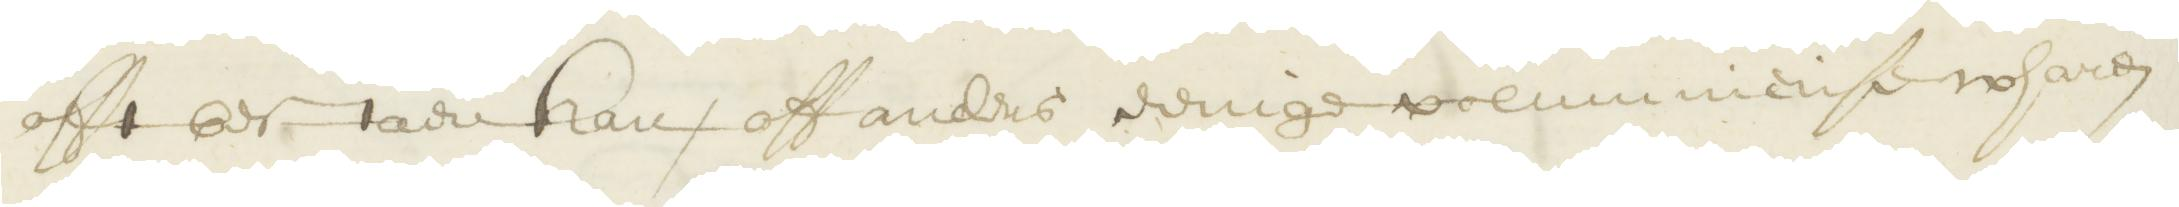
offt bestaen kan, off anders eenige volumineusen haren
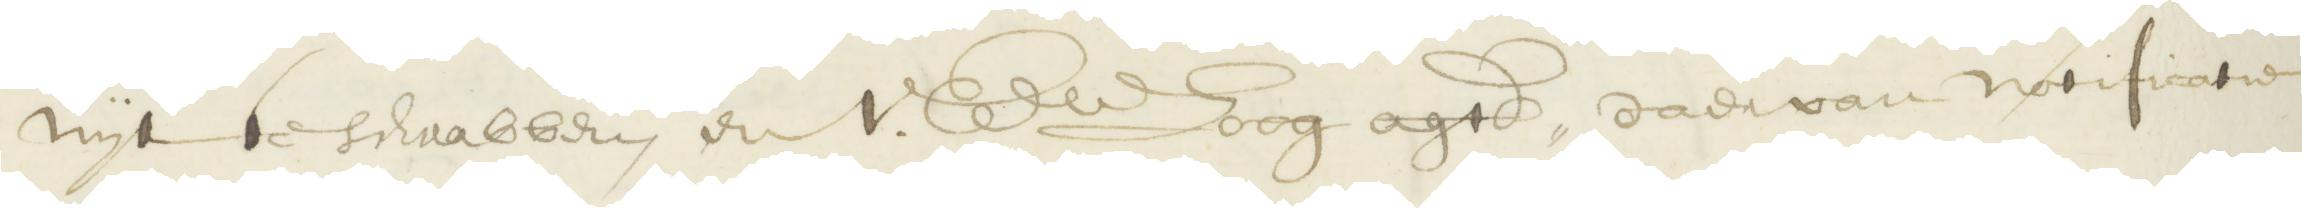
uijt te schrabben, en V. Ed=le Hoog agtb„ daervan notificatie
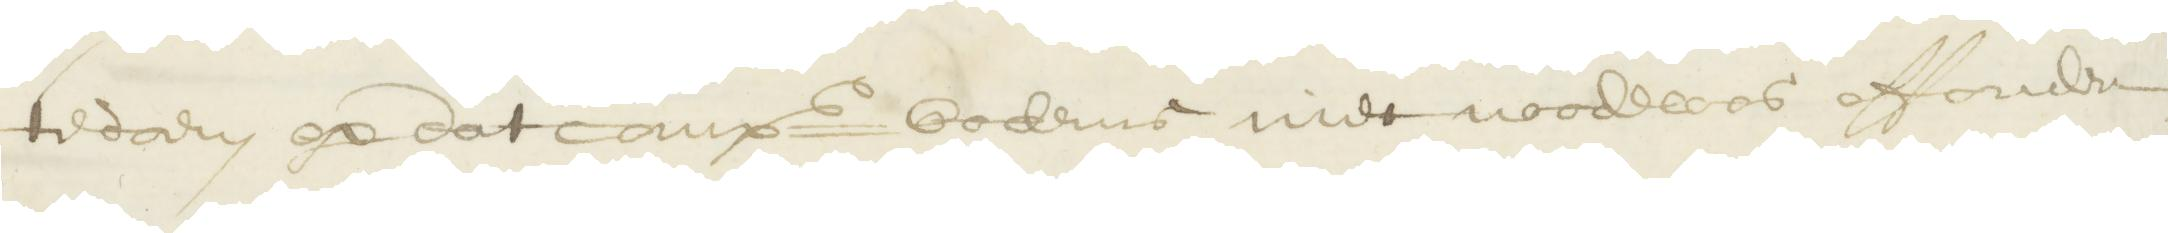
te doen, op dat comp=s bodems niet noodeloos off onder
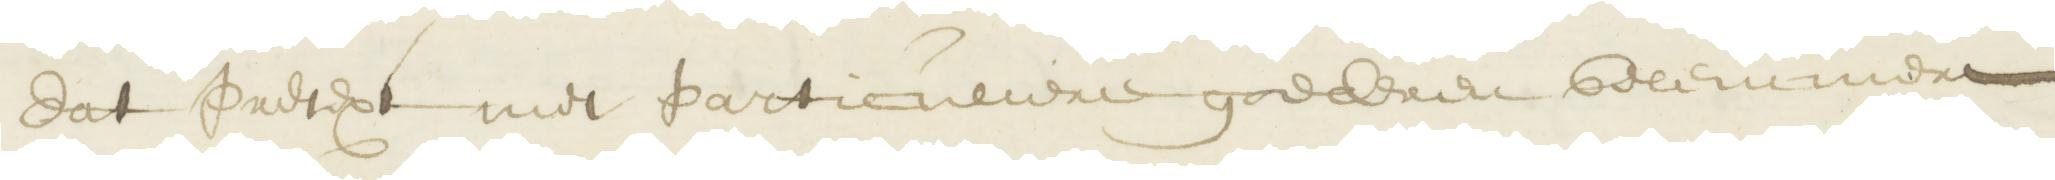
dat pretext met particuliere goederen belemmert
